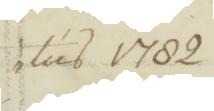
tus 1782
